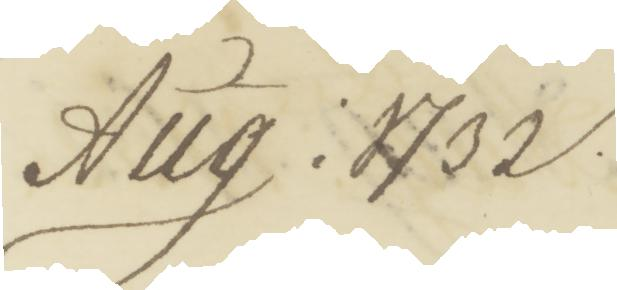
Aug: 1732.
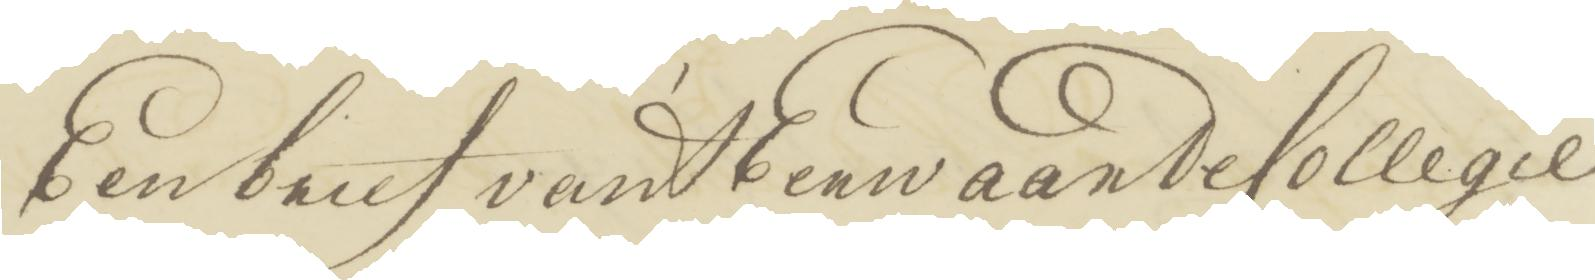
Een brief van't Eerwaarde Collegie
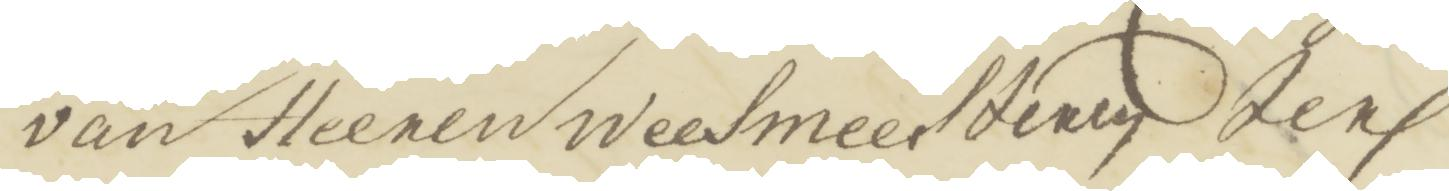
van Heeren weesmeesteren ter
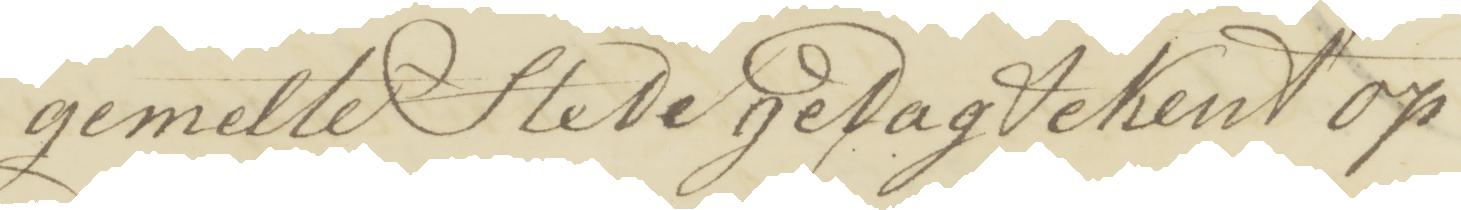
gemelte Stede gedagtekent op
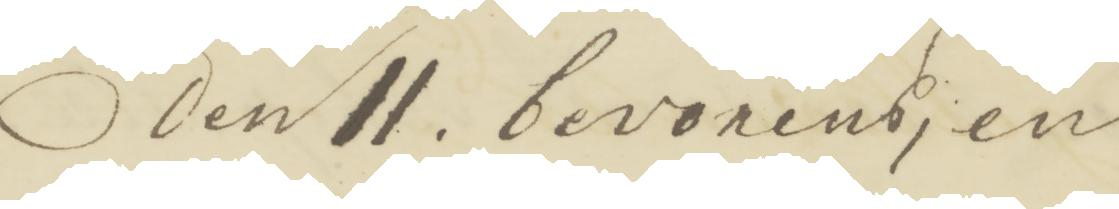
den 11. bevorens, en
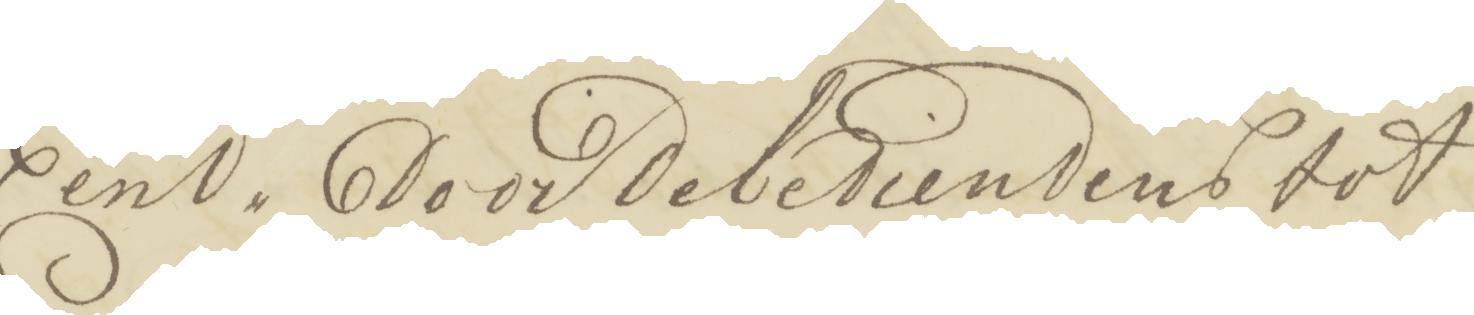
Een d„to door de bediendens tot
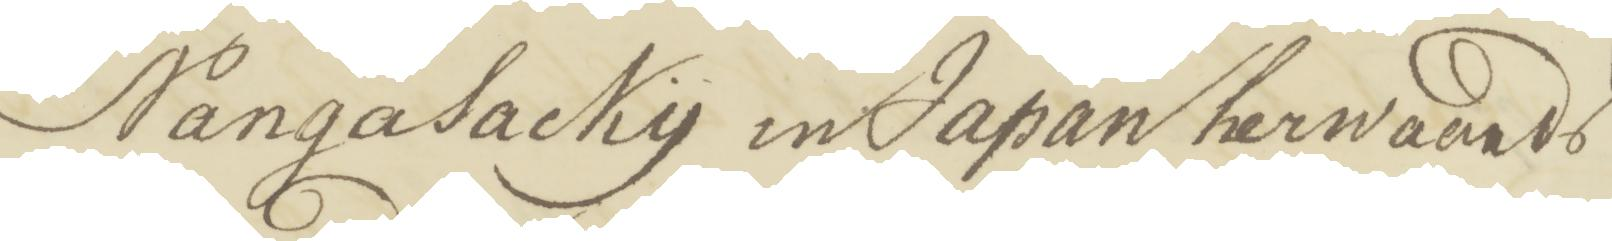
Nangasackij in Iapan herwaards
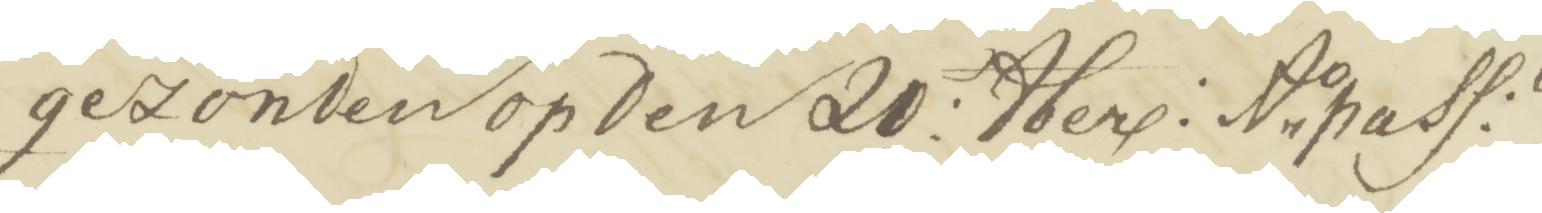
gezonden op den 20:' 8ber: A„o pass:o
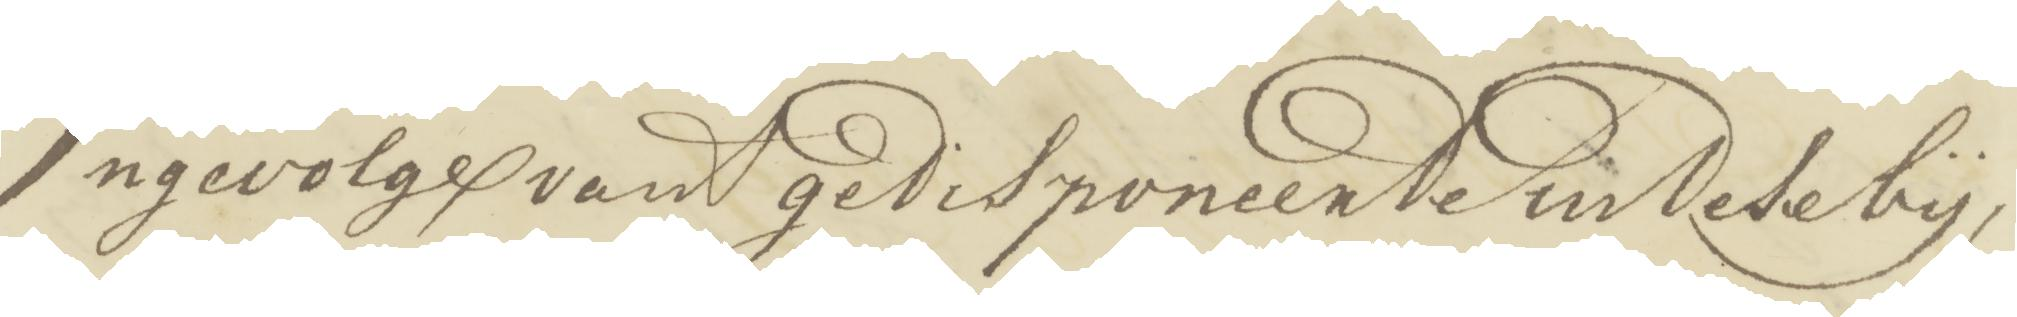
Ingevolge van 't gedisponeerde in dese bij„
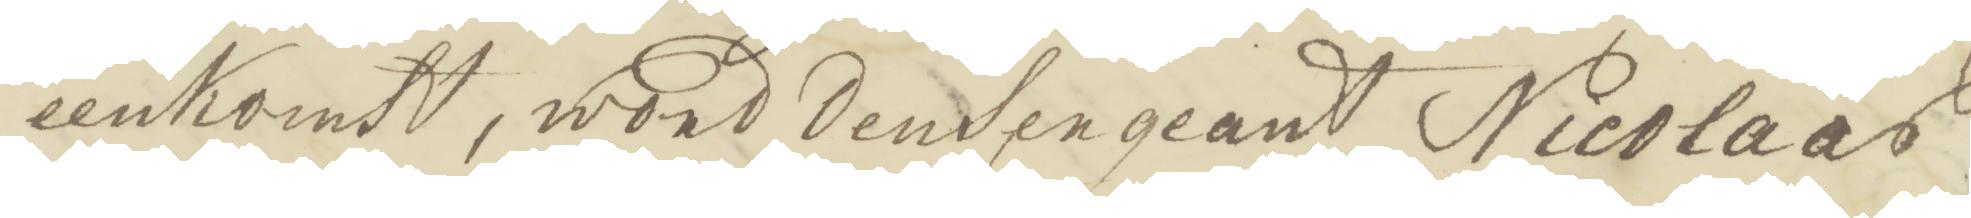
eenkomst, word den sergeant Nicolaas
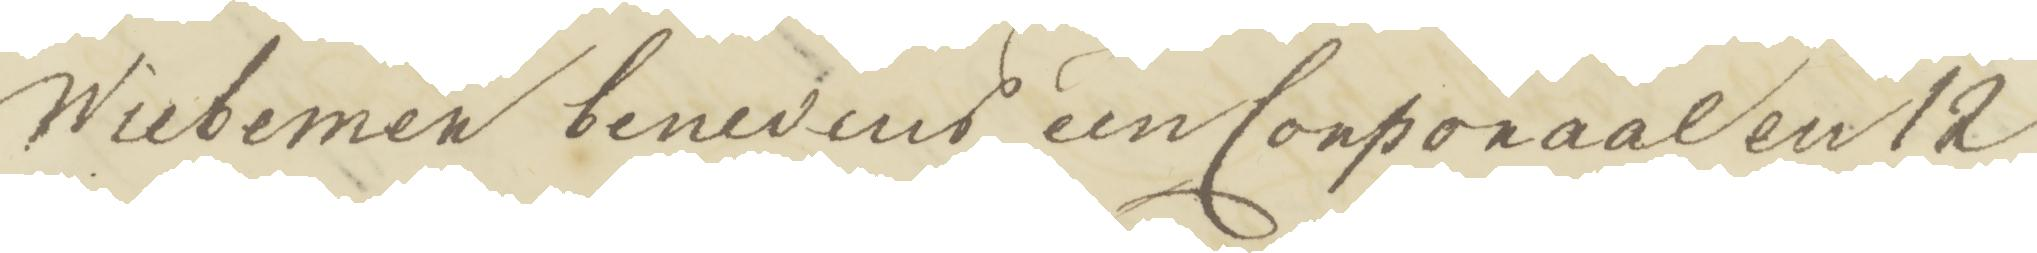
Wiebemer benevens een Corporaal en 12
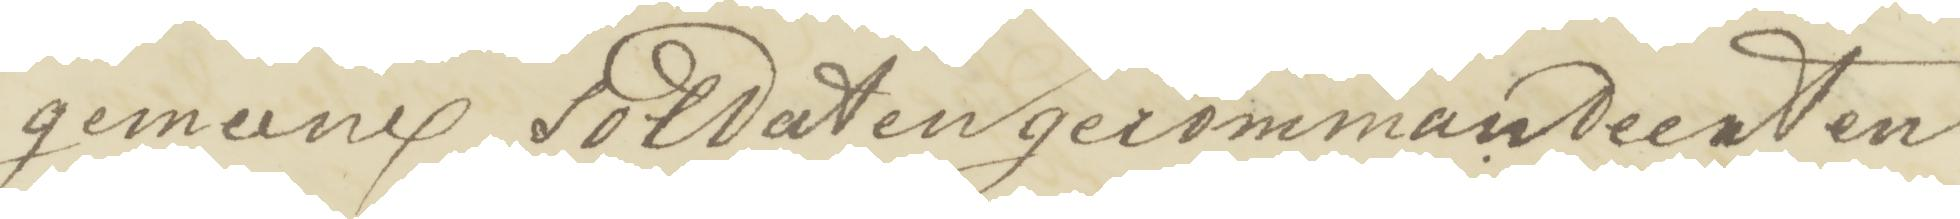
gemeene soldaten gecommandeert en
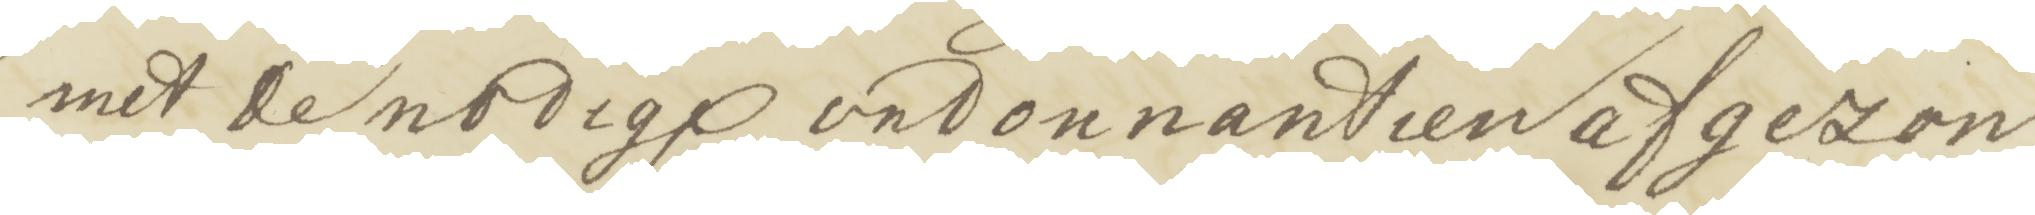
met de nodige ordonnantien afgezon
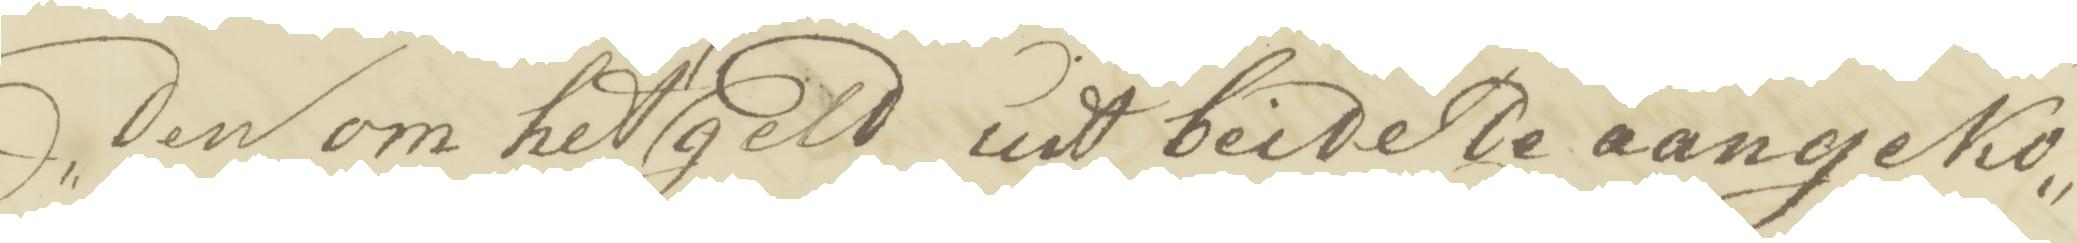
„den om het geld uit beide de aangeko„
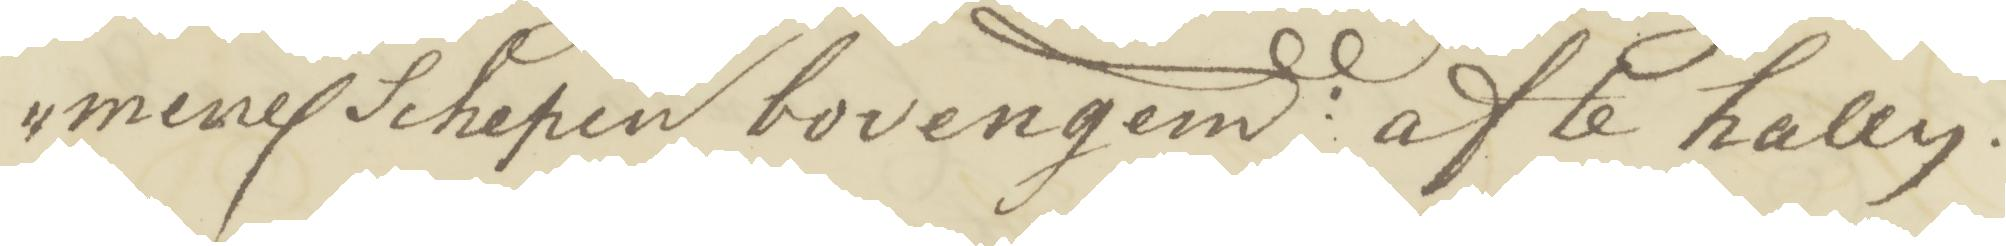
„mene schepen bovengem:' af te halen.
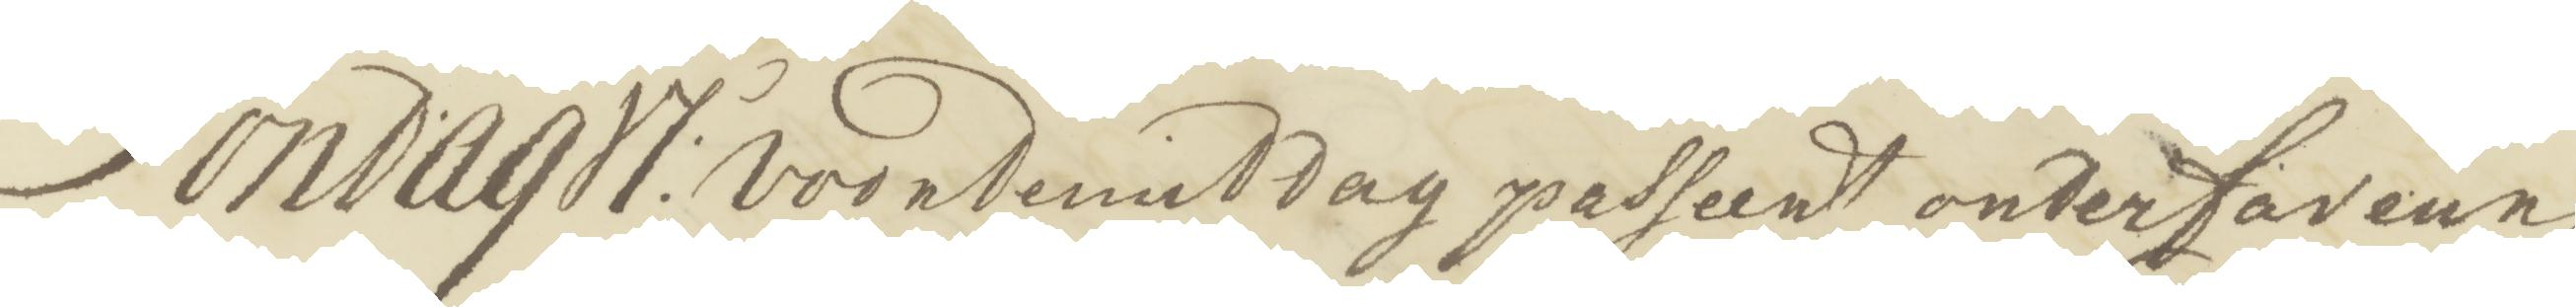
Sondag 17:' voor de middag passeert onder faveur
